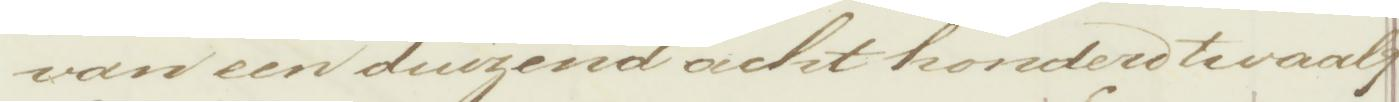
van een duizend acht honderd twaalf
